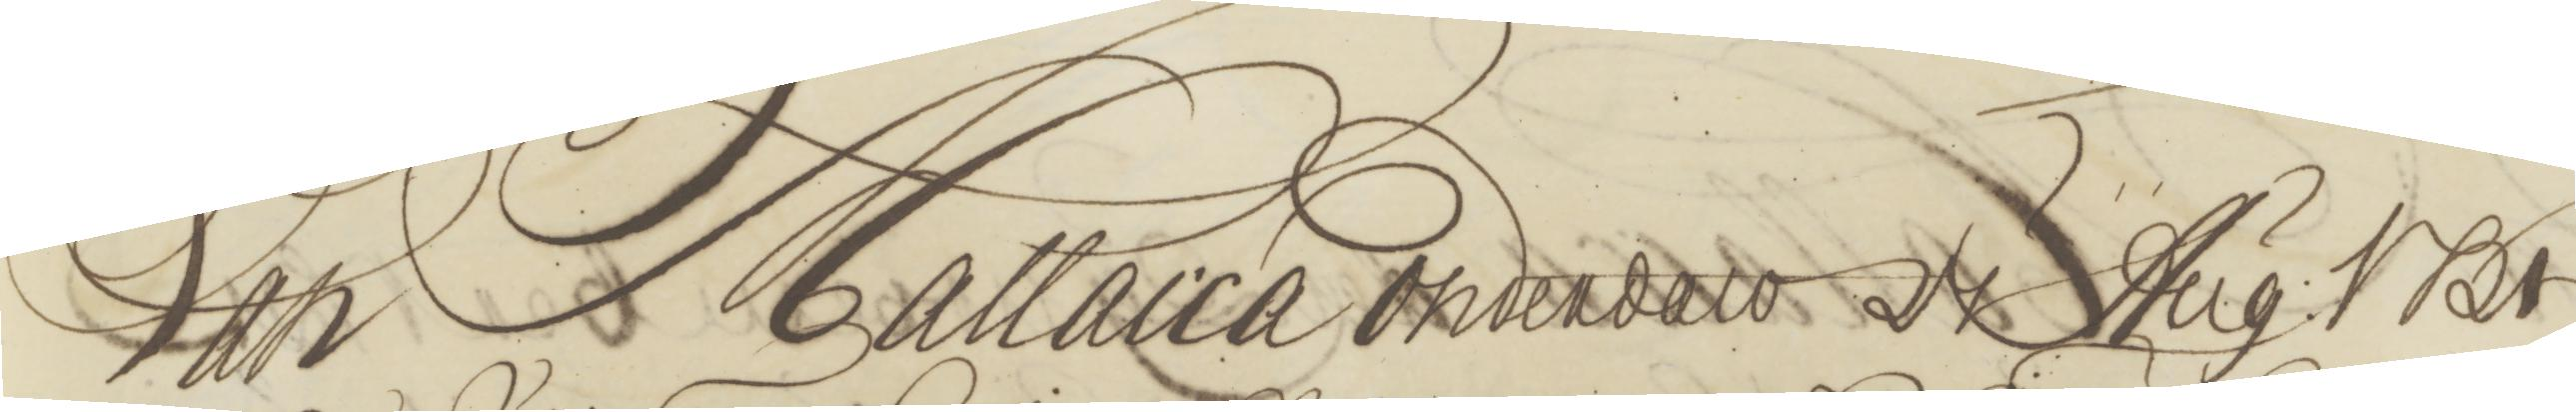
Van Mallacca onder dato 21e Aug: 1721
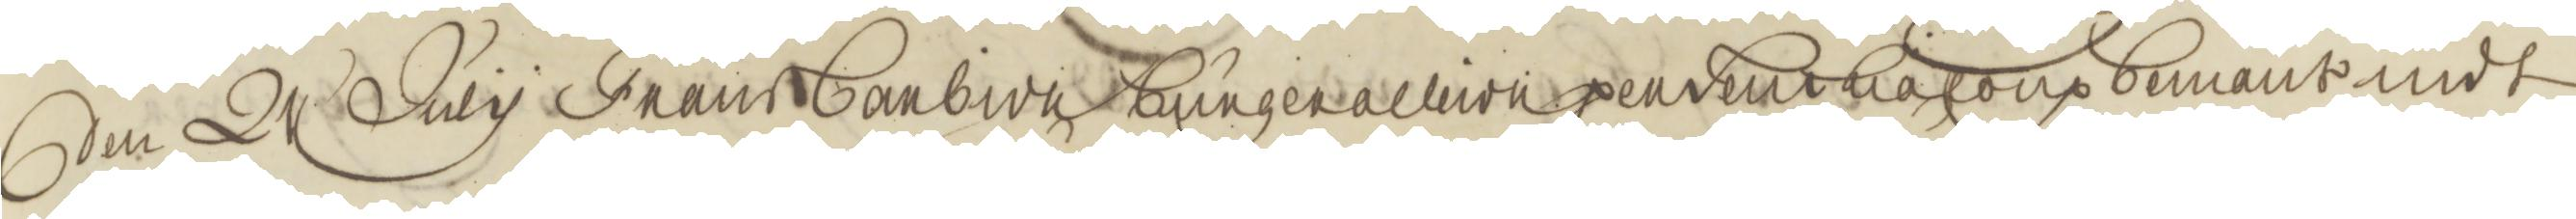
den 21 Iulij Frans barbier burger alhier per Een chaloup bemant met
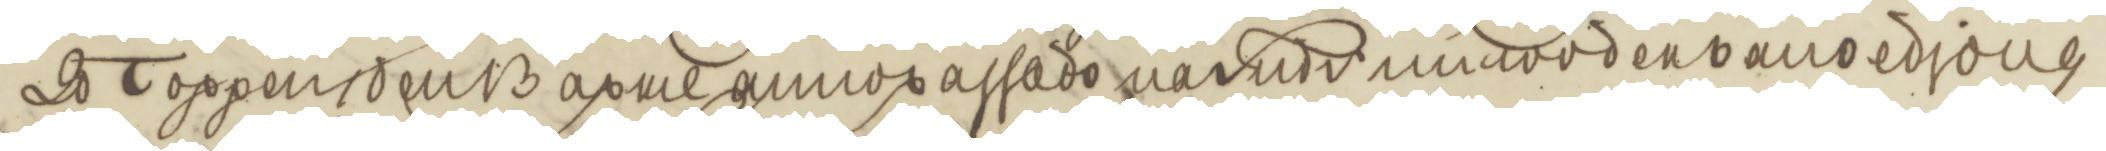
20 Coppen den 13' april anno passado na Ende nu weder van oedjong
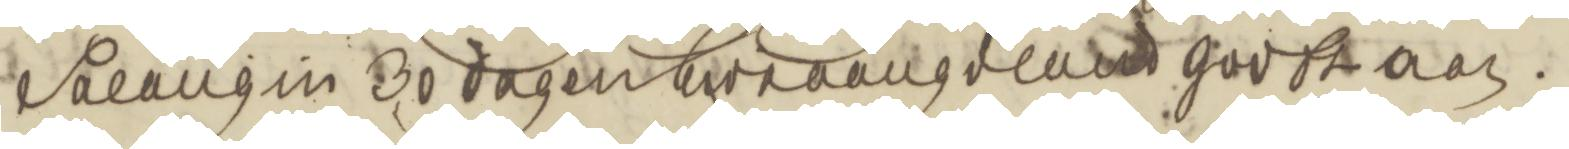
Salang in 30 dagen hier aangelaad geeft aan.
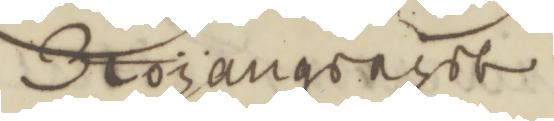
3 Coijangs rijst
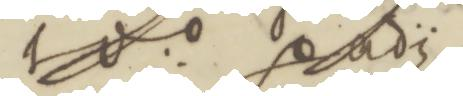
1 d:o padij
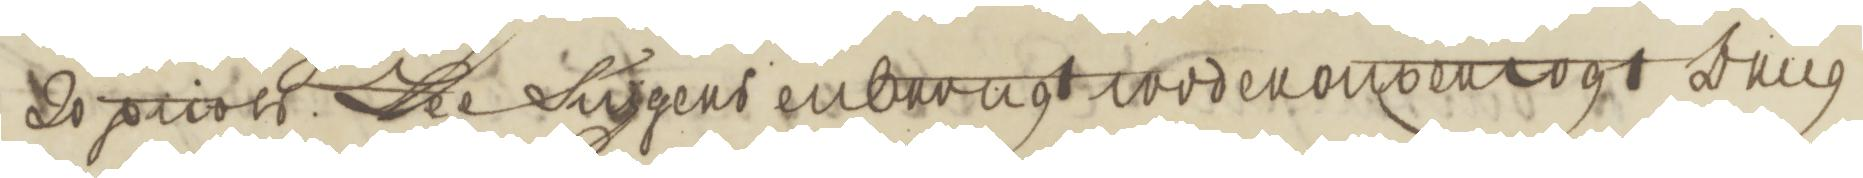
20 picols Zee Suigers en brengt weder onvercogt trug
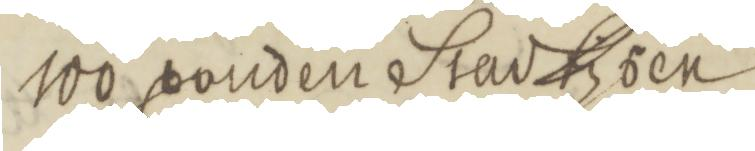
100 ponden staefijser
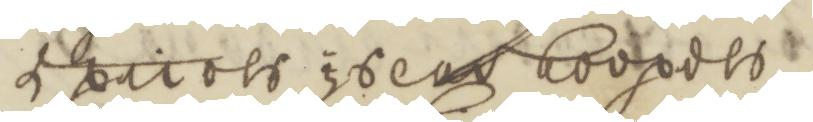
5 picols ijser koepels
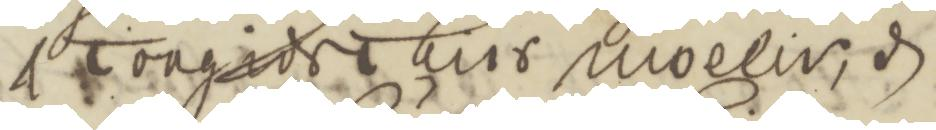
4 corgies kits moelie, en
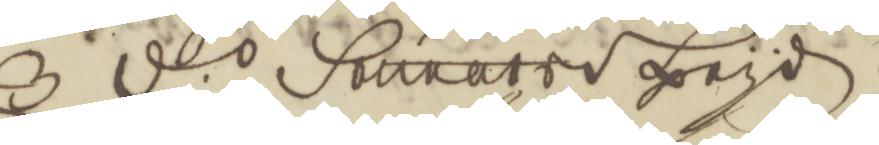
3 d:o Souratse sprijen
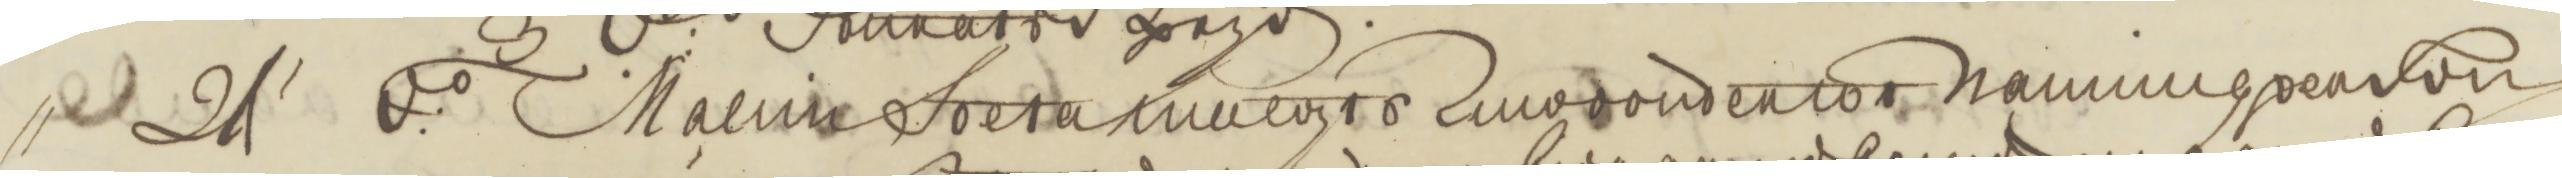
„ 24' d:o Malim Soeta maleyts Inwoonder tot Nanning per Een
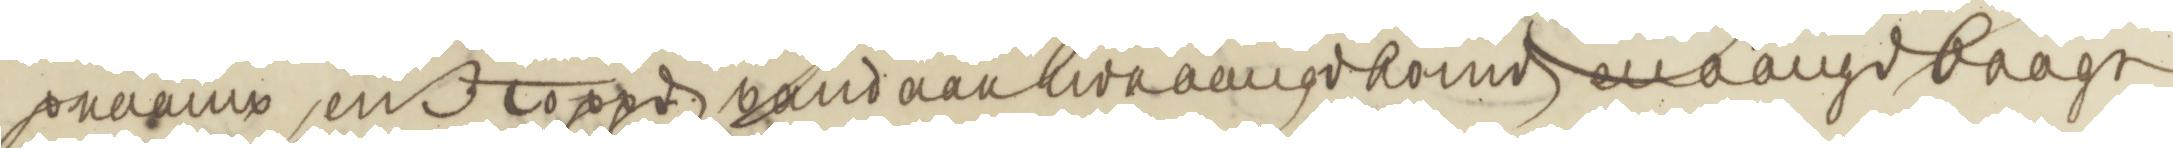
praauw, en 3 coppen vandaar hier aangekomen en aangebragt
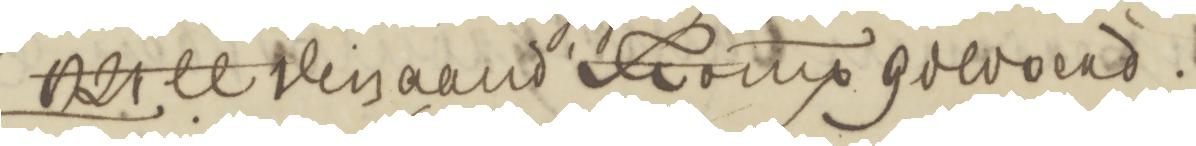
1721 lb thin aand’ Ecomp gelvoerd.
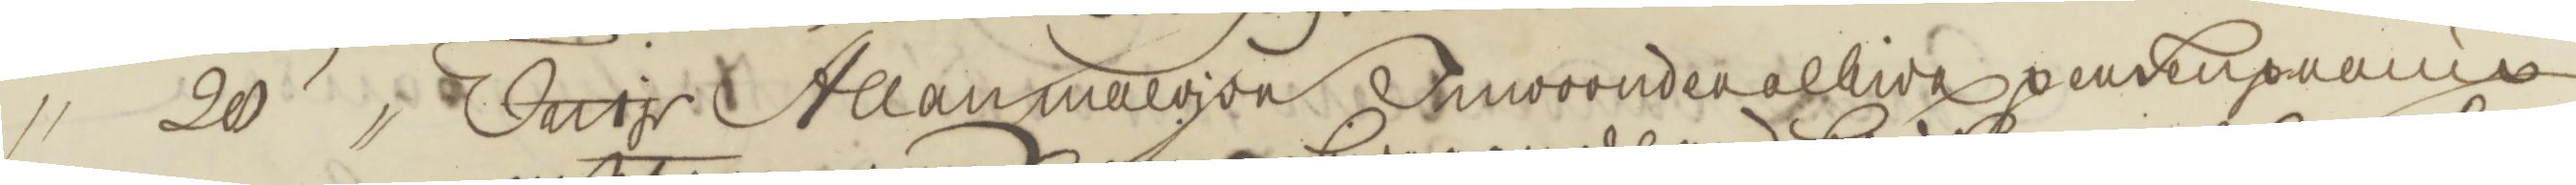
„ 28' „ Intje Allan malejer Inwoonder alhier per Een prauw
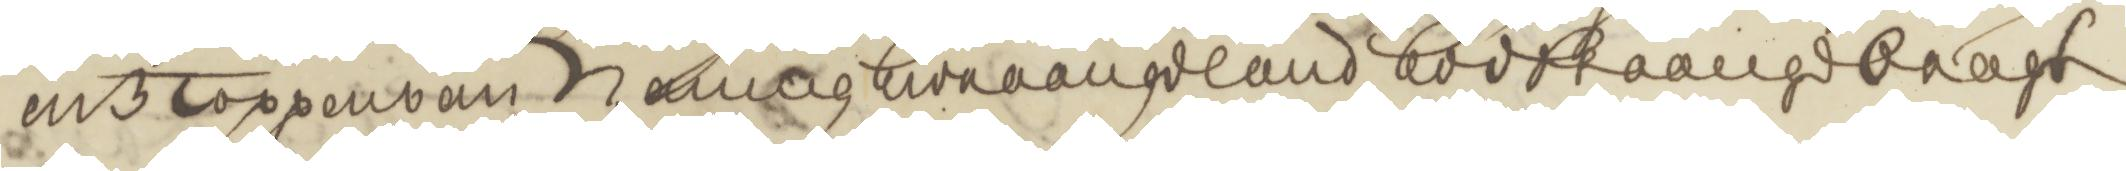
en 3 coppen van Naning hier aangeland heeft aangebragt
